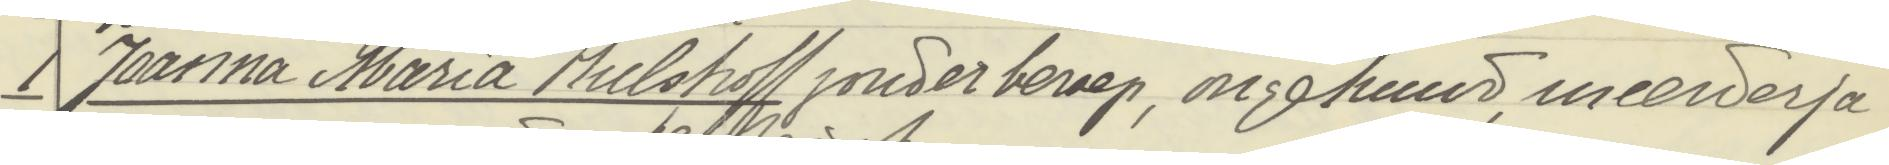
1 Joanna Maria Hulshoff zonder beroep, ongehuwd, meederja
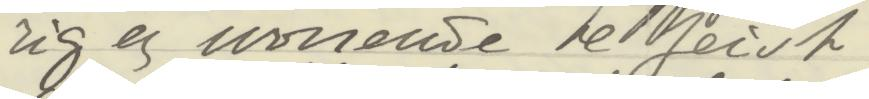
rig en wonende te Zeist
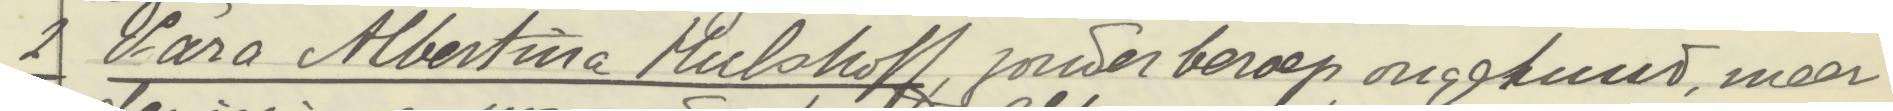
2 Sara Albertina Hulshoff, zonder beroep ongehuwd, meer
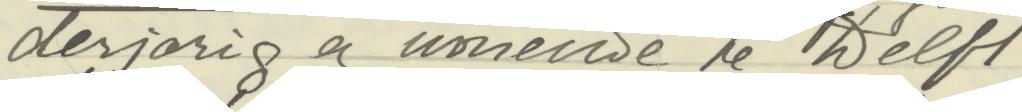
derjarig en wonende te Delft
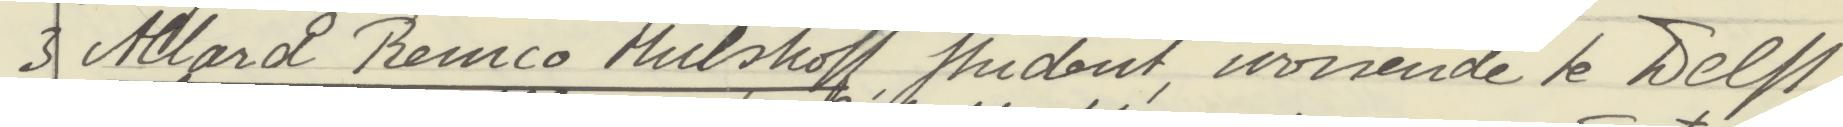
3 Allard Remco Hulshoff, student, wonende te Delft
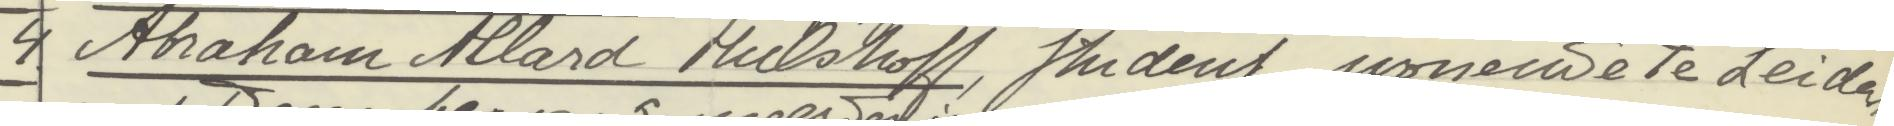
4 Abraham Allard Hulshoff, student, wonende te Leiden
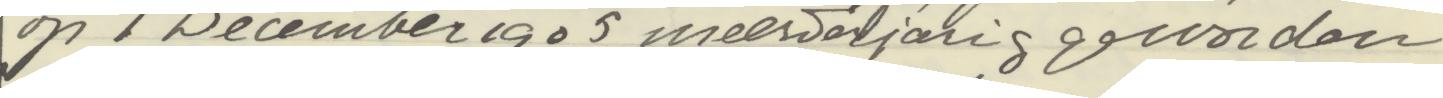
op 1 December 1905 meederjarig geworden
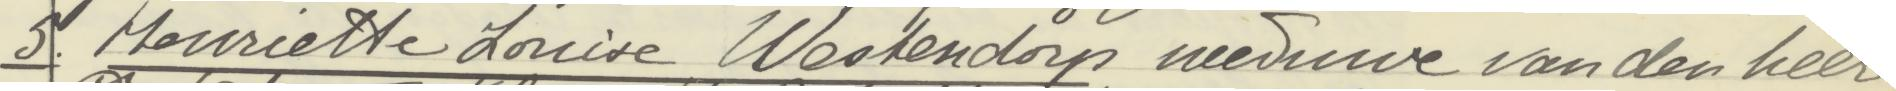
5. Henriette Louise Westendorp, weduwe van den heer
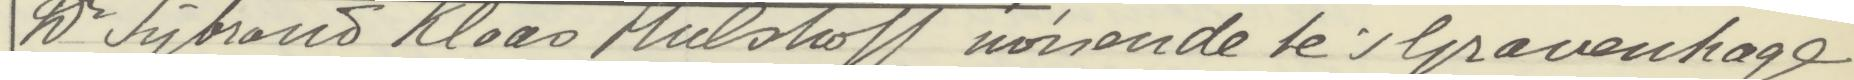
Dr Sijbrand Klaas Hulshoff, wonende te 's Gravenhage
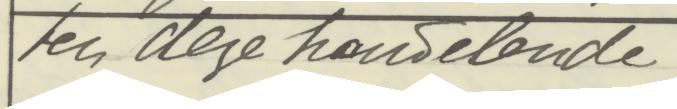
ten deze handelende
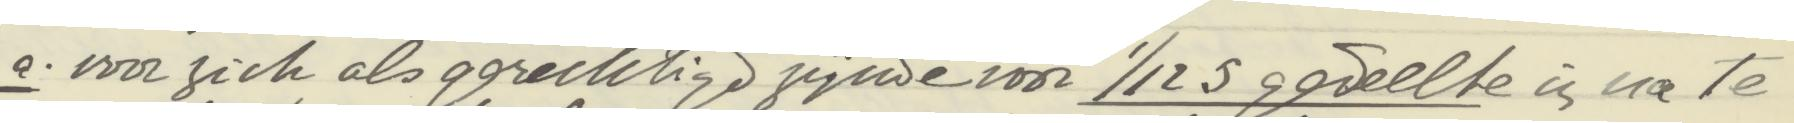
a. voor zich als gerechtigd zijnde voor 1/125 gedeelte in na te
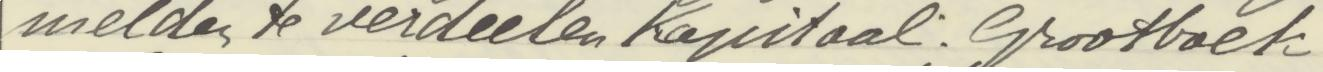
melden te verdeelen kapitaal: Grootboek
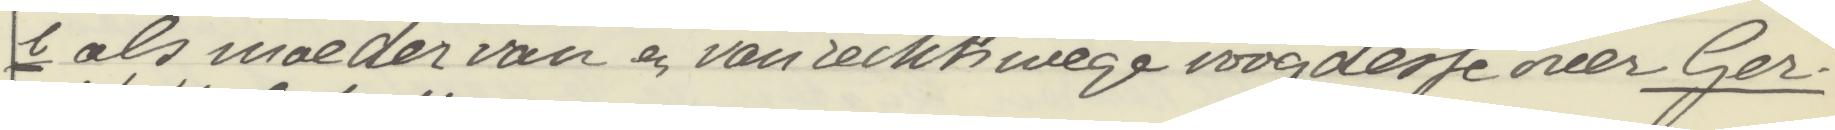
b als moeder van en van rechtswege voogdesse over Ger
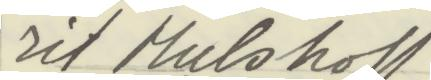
rit Hulshoff
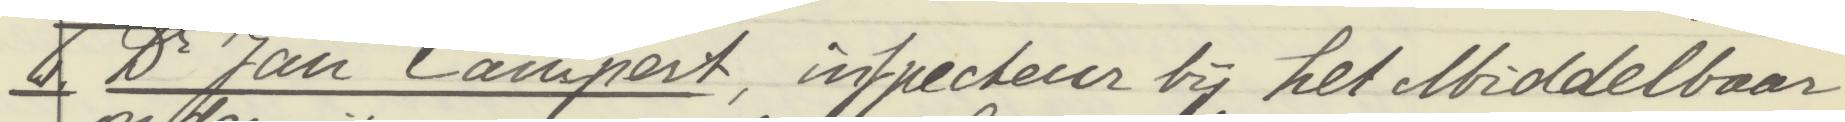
6. Dr Jan Campert, inspecteur bij het Middelbaar
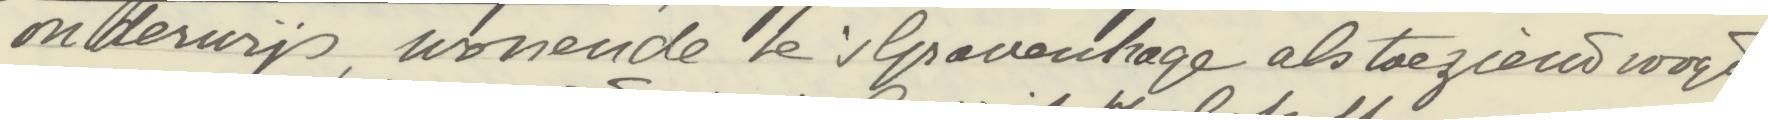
onderwijs, wonende te 's Gravenhage als toeziend voogd
